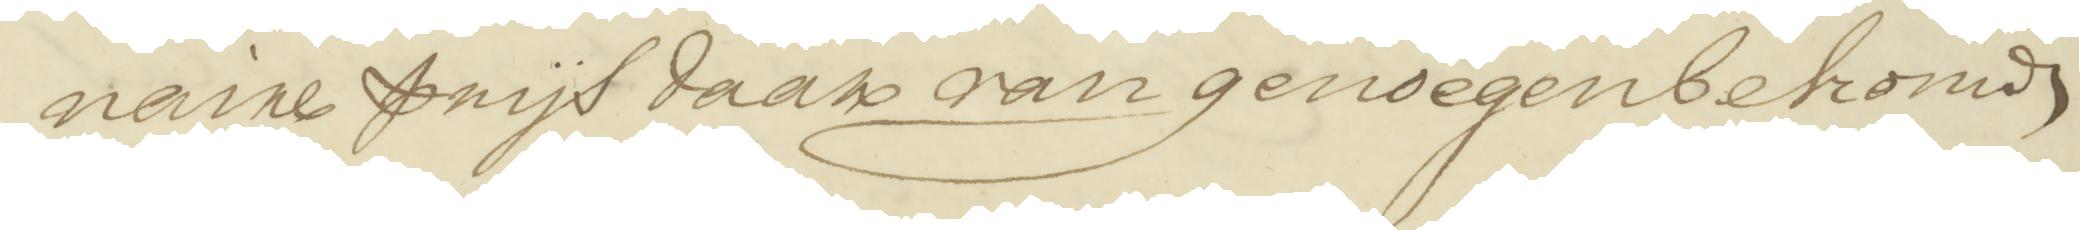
naire prijs daar van genoegen bekomen
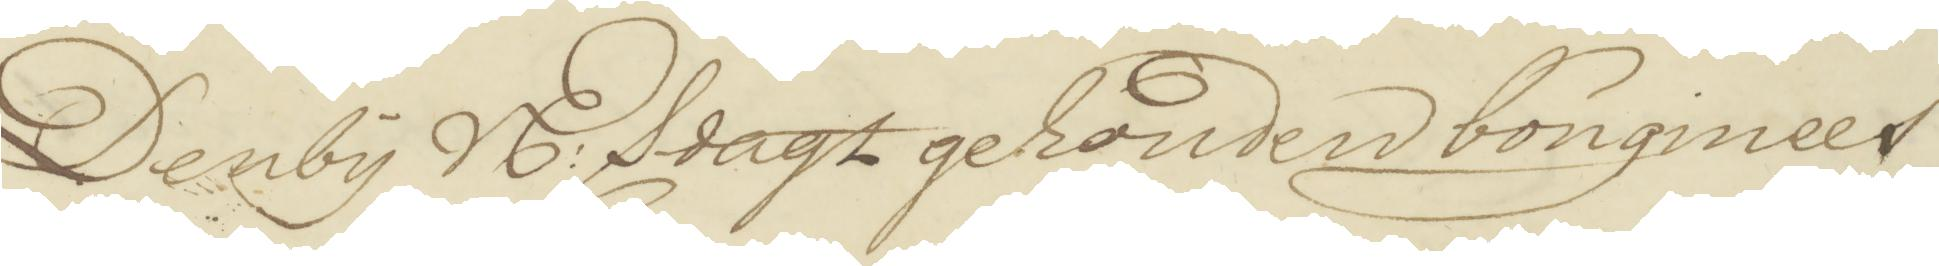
Den bij UE: verdagt gehouden bouginees
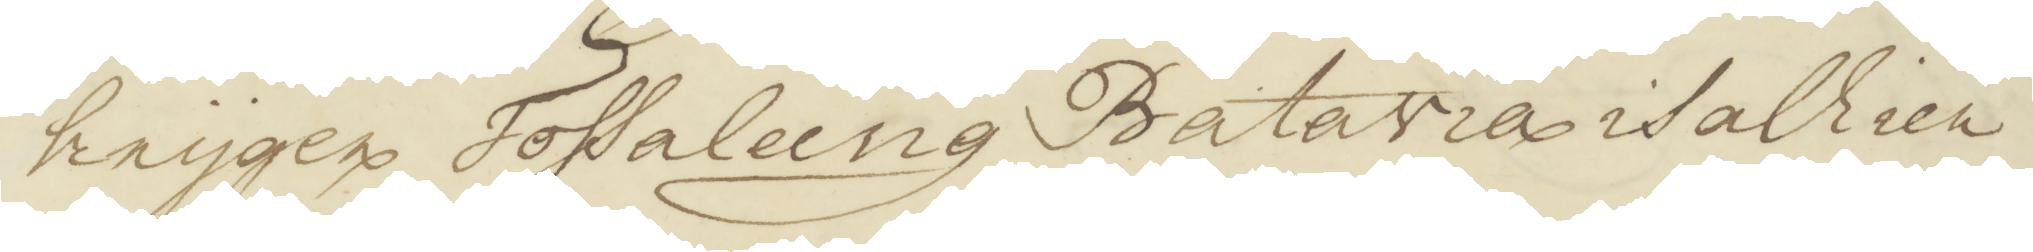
krijger Tossaleeng Batavia is alhier
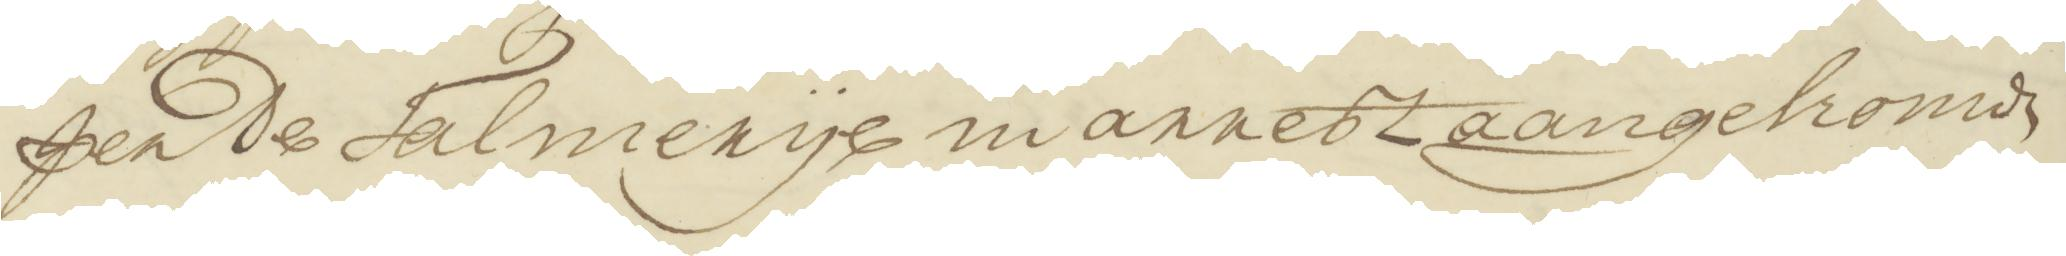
per de Talmerije in arrest aangekomen
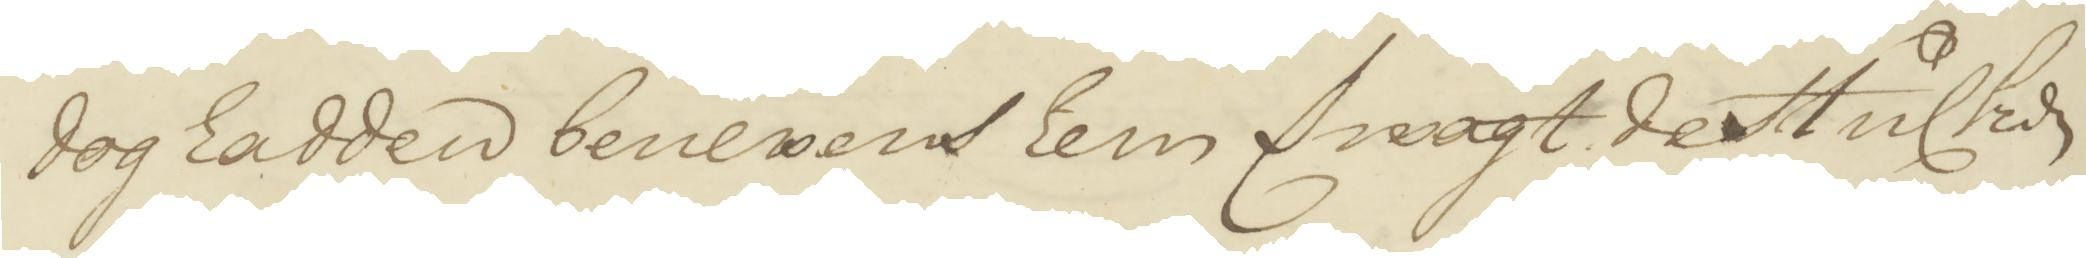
dog hadden benevens hem verwagt de stucken
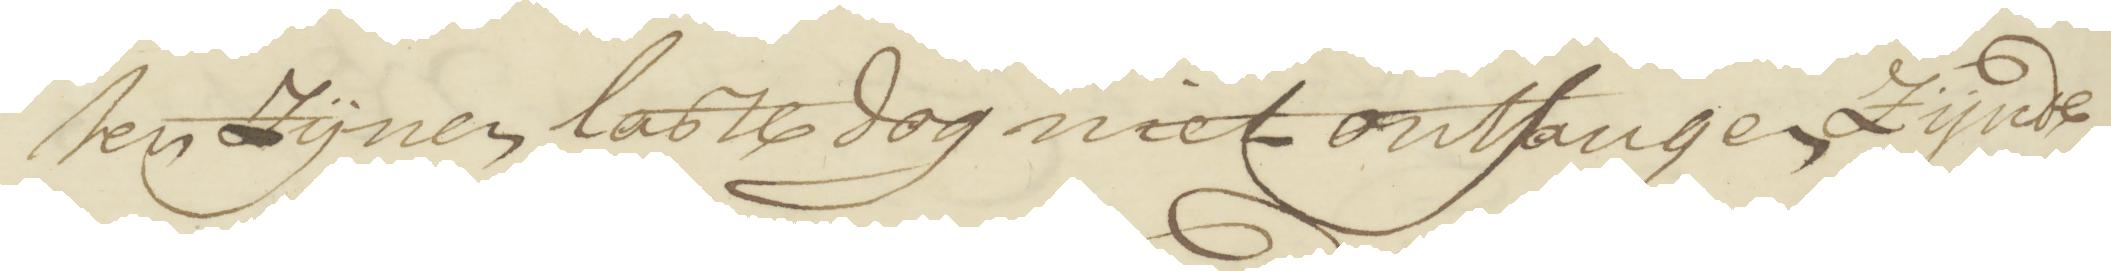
ten zijnen laste dog niet ontfangen zijnde
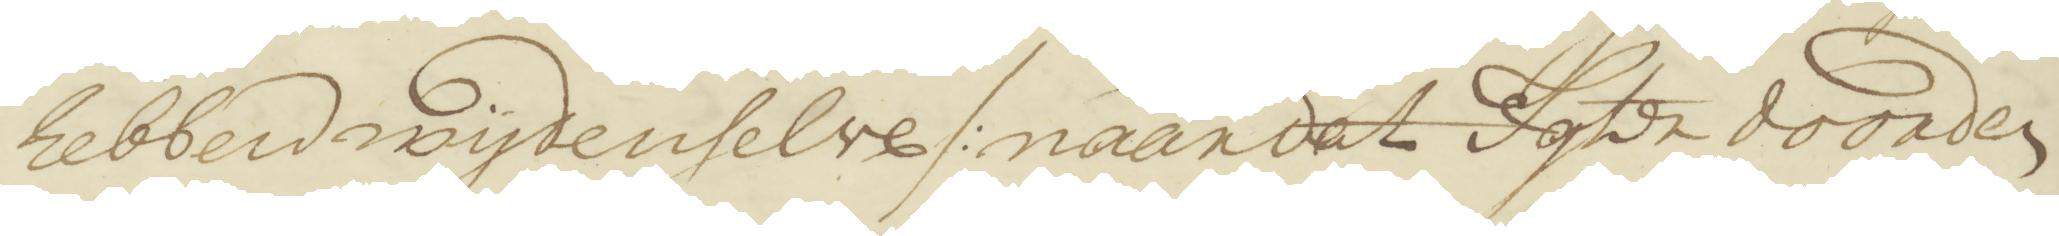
hebben wij den selve /:naar dat Egter door den
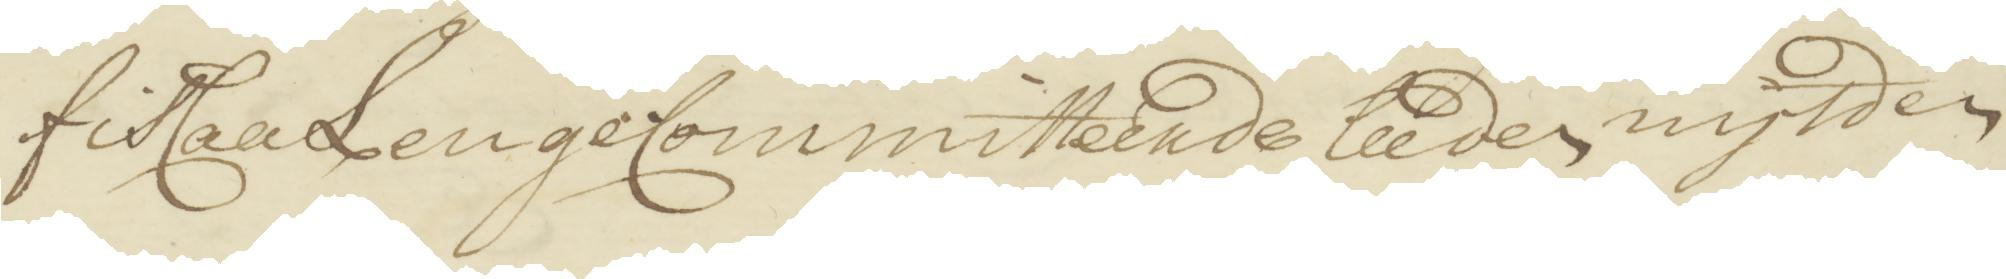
fiscaal en gecommitteerde leeden uijt den
